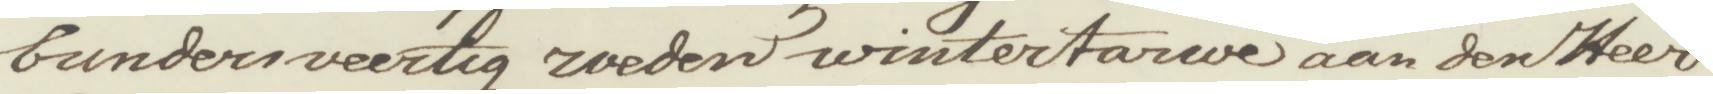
bunders veertig roeden wintertarwe aan den Heer
